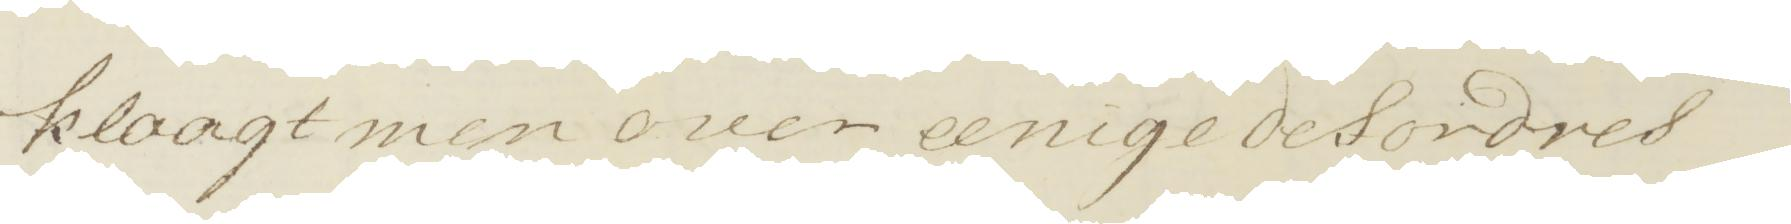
klaagt men over eenige desordres
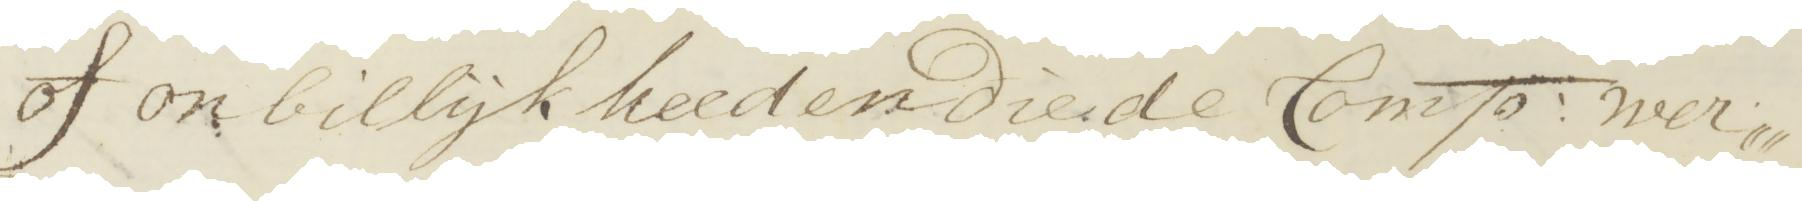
of onbillijkheeden die de Comp: wer„„
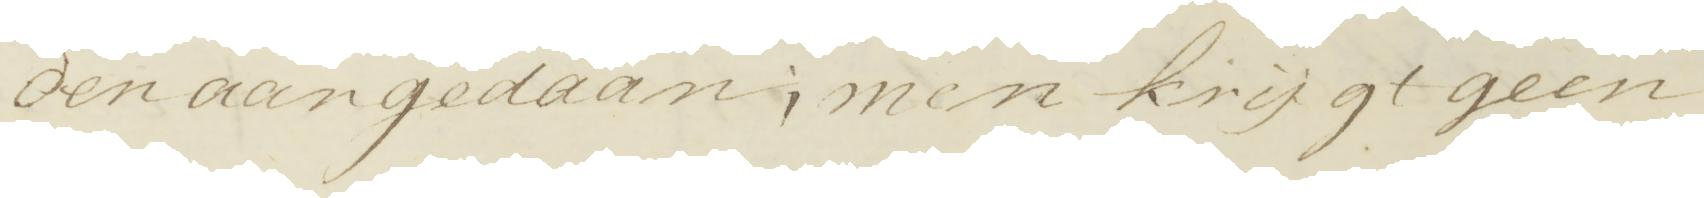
den aangedaan; men krijgt geen
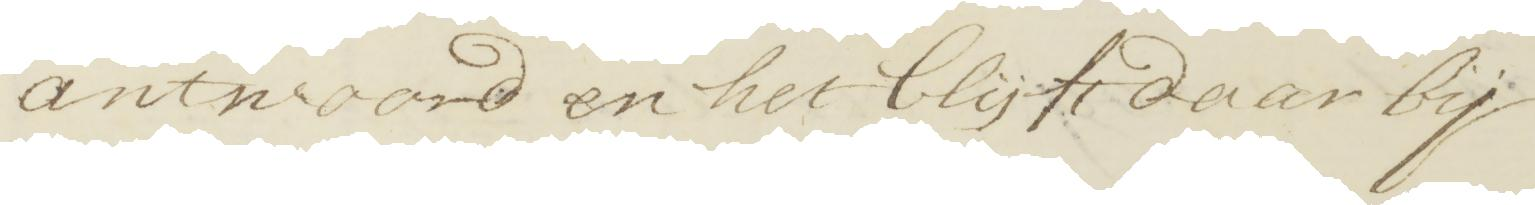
antwoord en het blijft daar bij
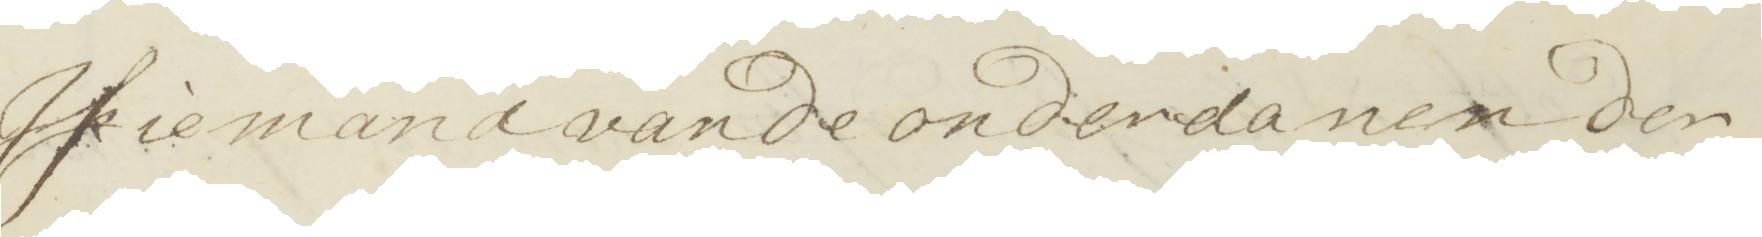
Niemand van de onderdanen der
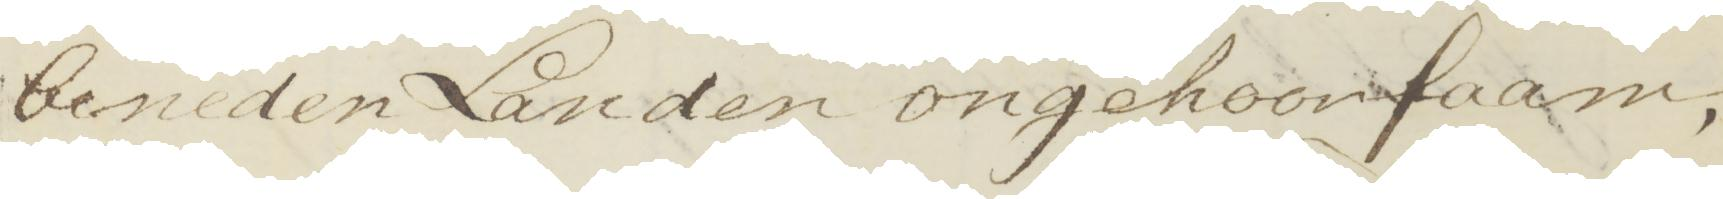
beneden Landen ongehoorsaam,
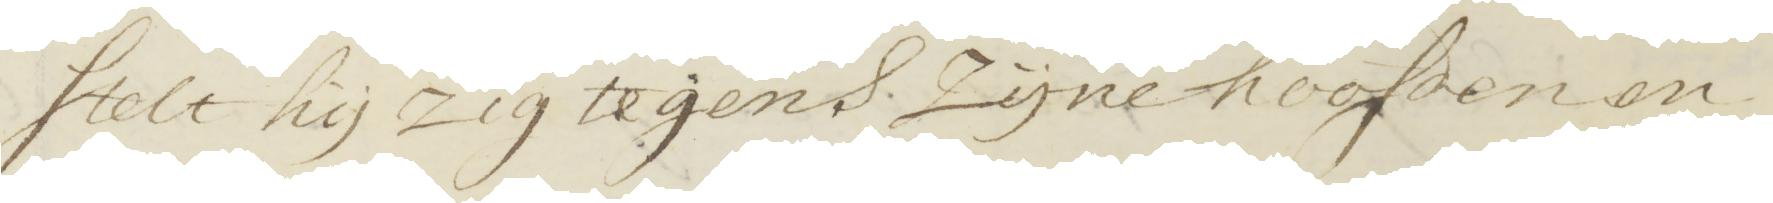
stelt hij zig tegens zijne hoofden en
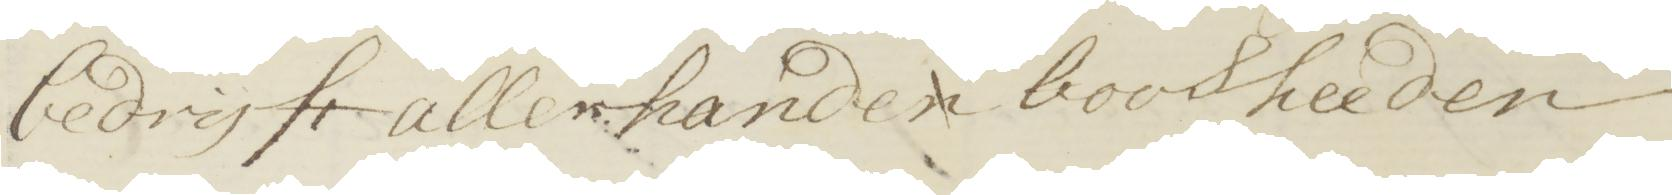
bedrijft allerhanden boosheeden
